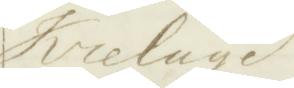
Krelage
